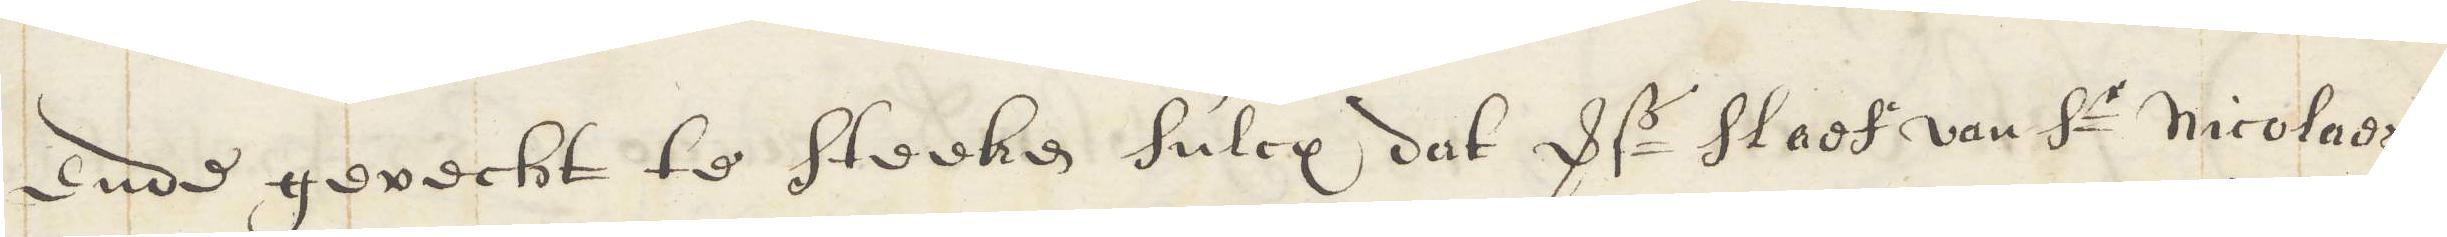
ende gevecht te steeken sulcx dat vers=z slaef van s=r Nicolaes-
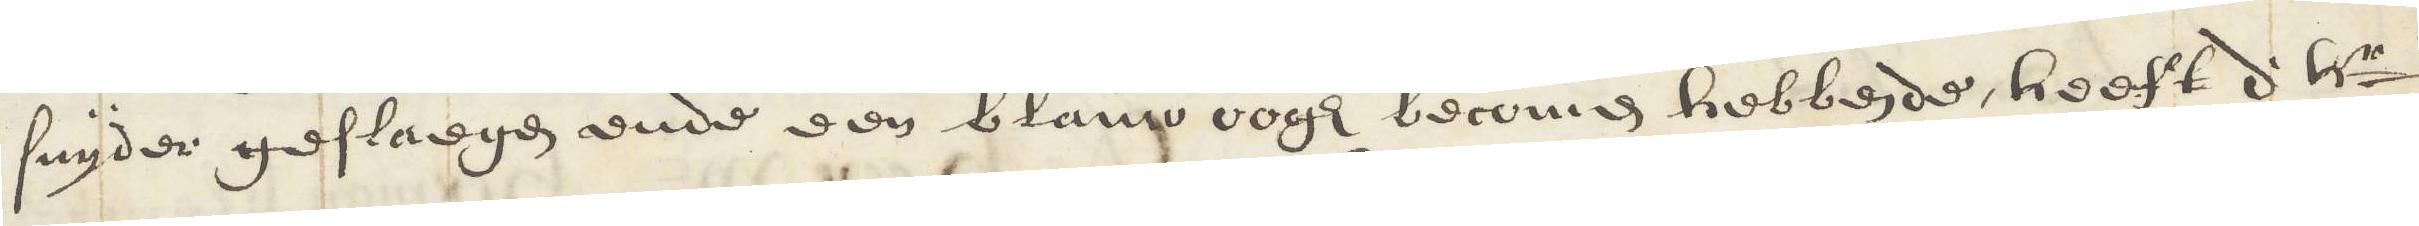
snijder geslaegen ende een blauw oogh becomen hebbende, heeft d’ h=r
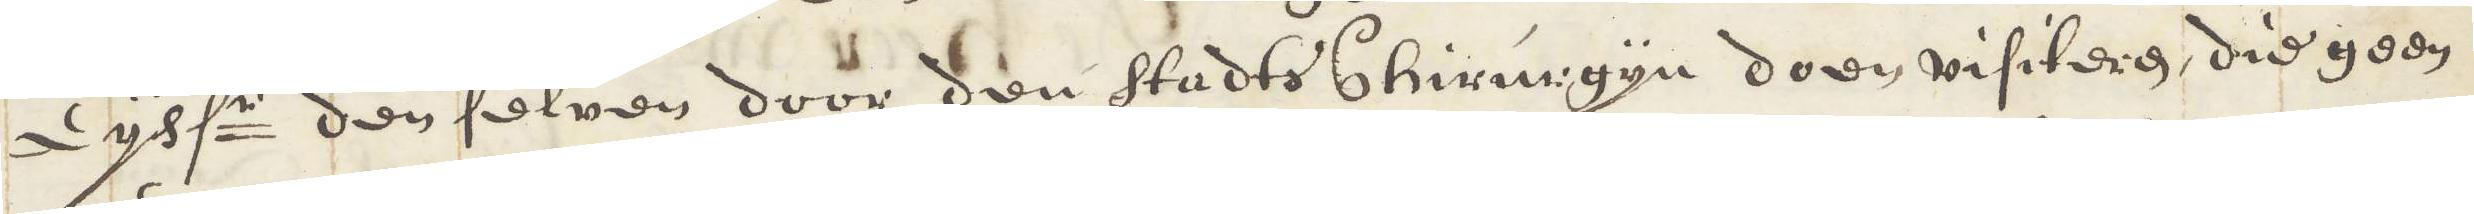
Eijss=r den selven door den stadts Chirurgijn doen visiteren, die geen
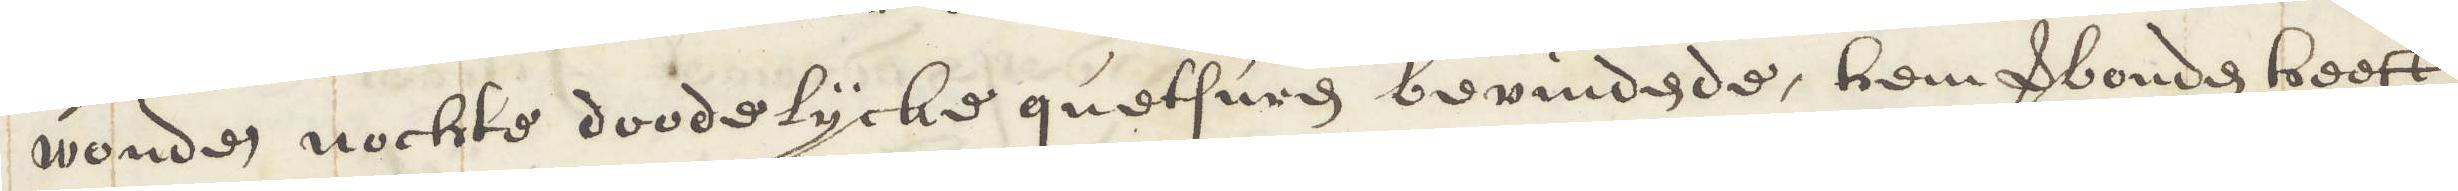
wonden nochte doodelijcke quetsuren bevindende, hem verbonden heeft
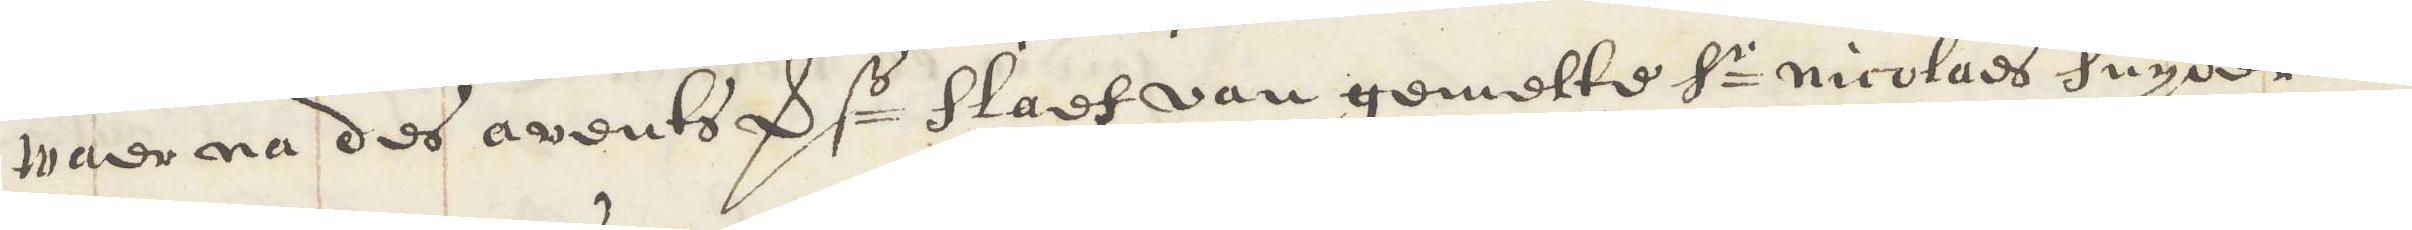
waer na des avent vers=z slaef van gemelte s=r nicolaes snijder —
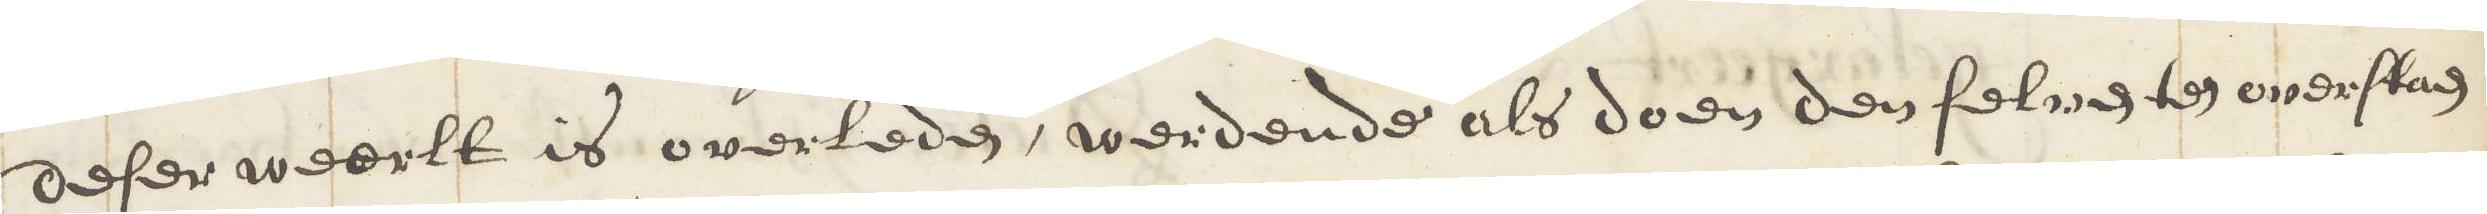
deser weerlt is overleden, werdende als doen den selven ten overstaen
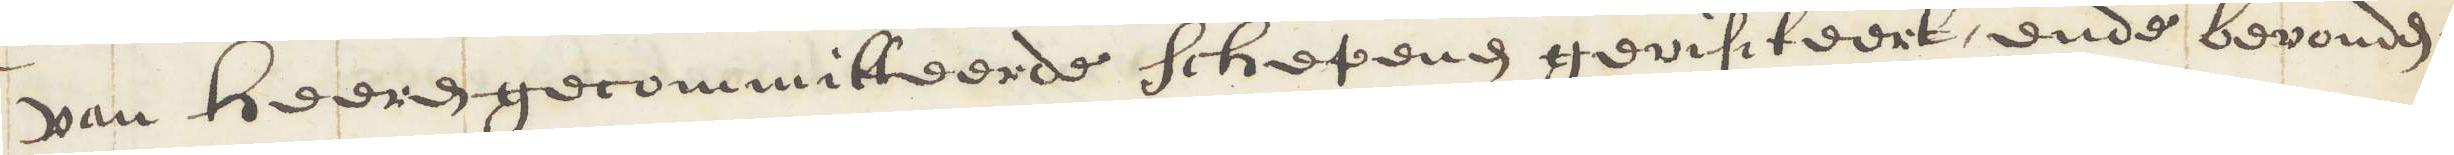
van heere gecommitteerde schepenen gevisiteert, ende bevonden
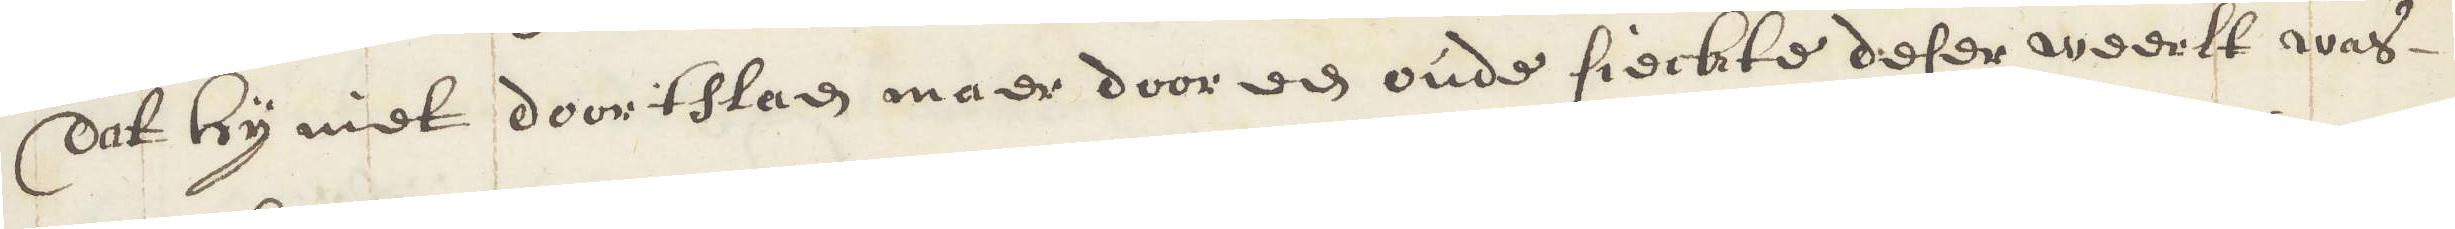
dat hij niet door ’t slaen maer door een oude sieckte deser weerlt was-
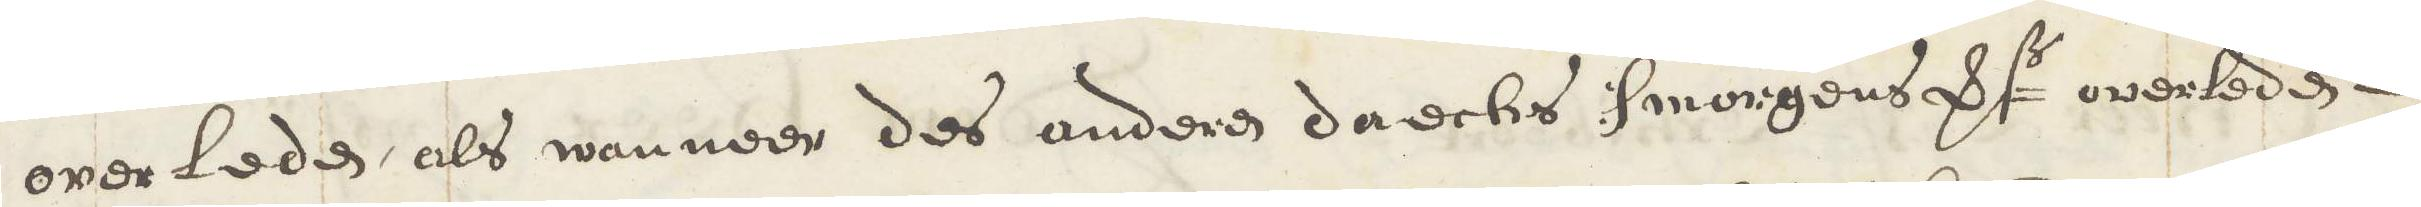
overleden, als wanneer des anderen daechs 'smorgens vers=z overleden —
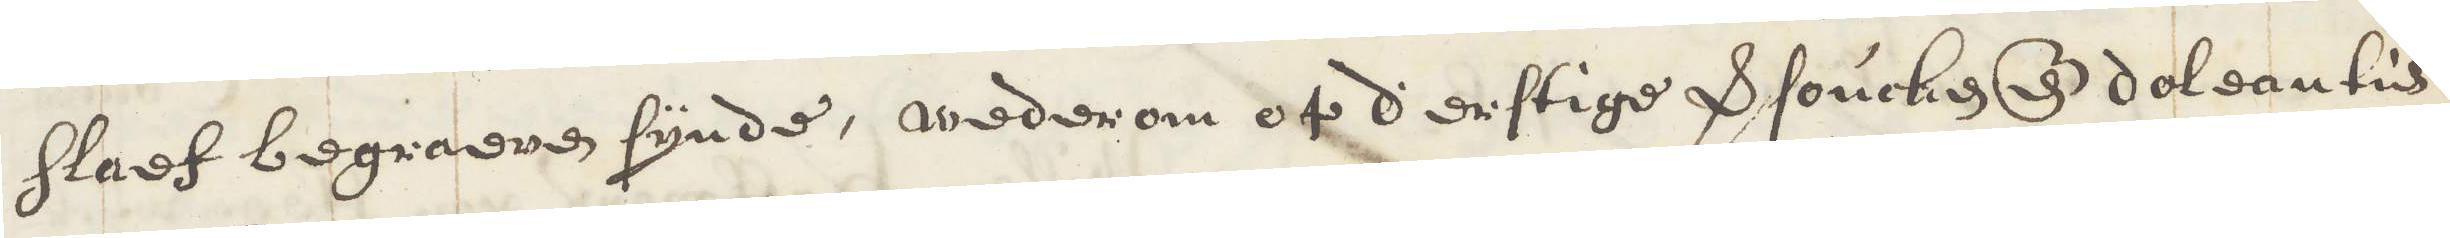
slaef begraeven sijnde, wederom op d’ erstige versoucken ende doleantie
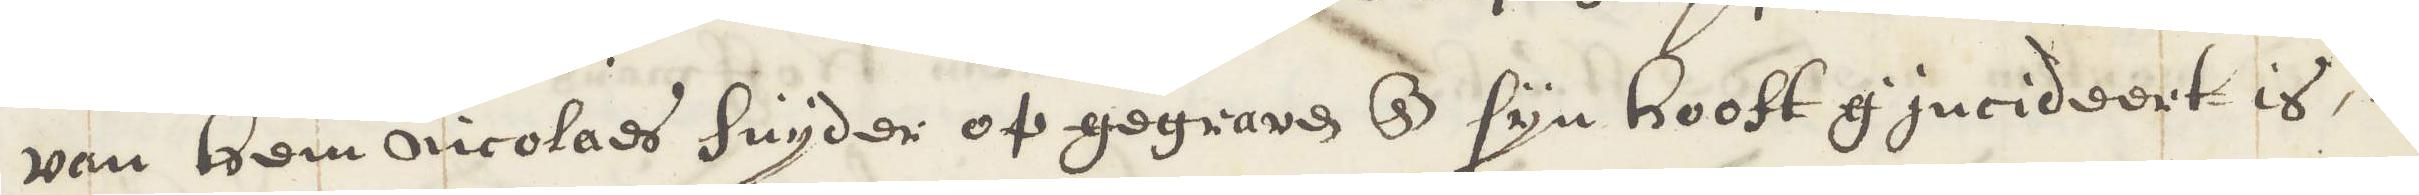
van hem nicolaes snijder op gegraven ende sijn hooft g’jncideert is, —
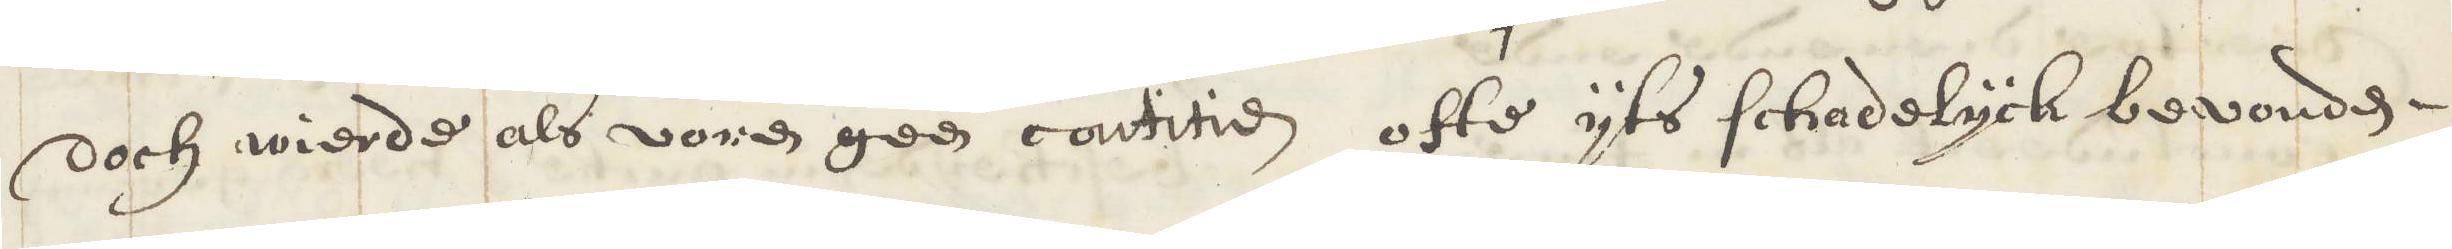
doch wierde als voren geen contitien ofte ijts schadelijck bevonden—
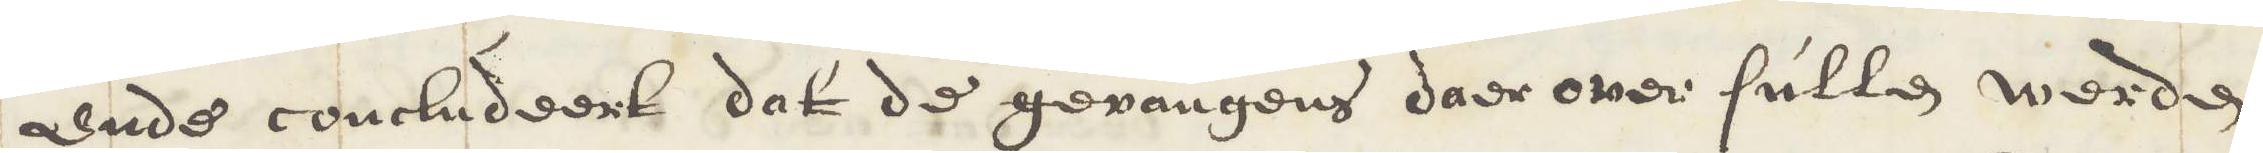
ende concludeert dat de gevangen daer over sullen werden
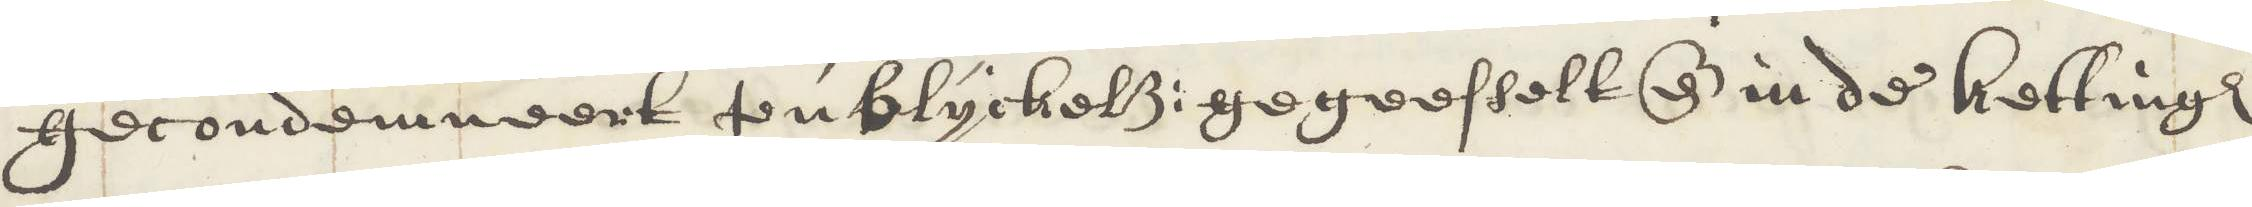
gecondemneert publijckelijk gegeesselt ende in de kettingh
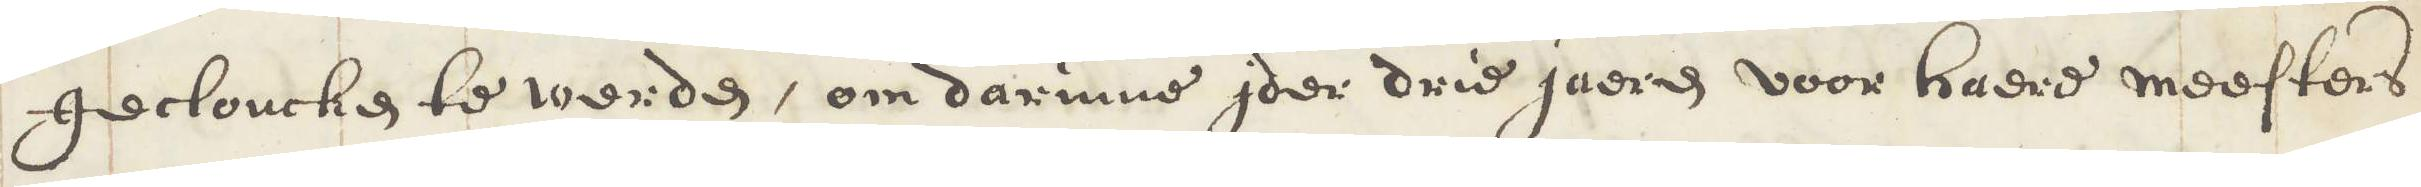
gecloncken te werden, om darinne jder drie jaeren voor haere meesters
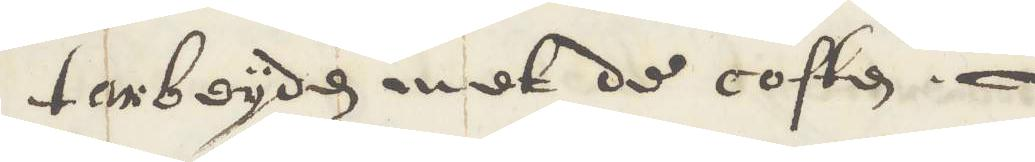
t arbeijden met de costen.—
